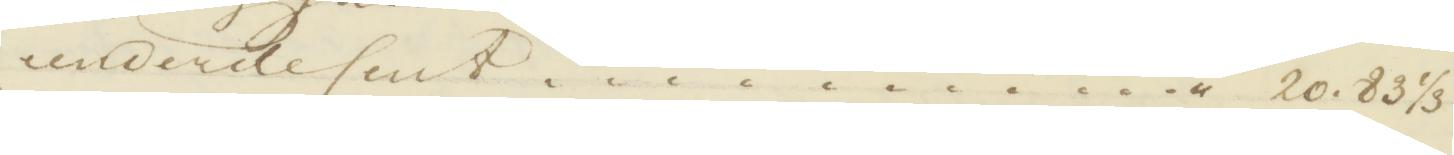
een derde Cent . . . . . . . . . . . „ 20. 83 1/3
